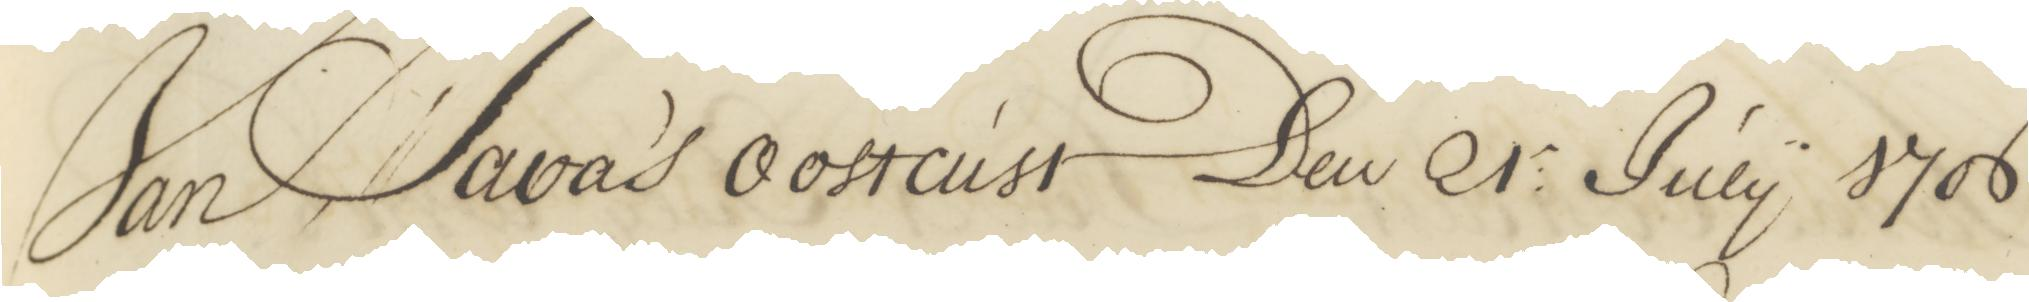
Van Java's oostcust Den 21:' Iulij 1706
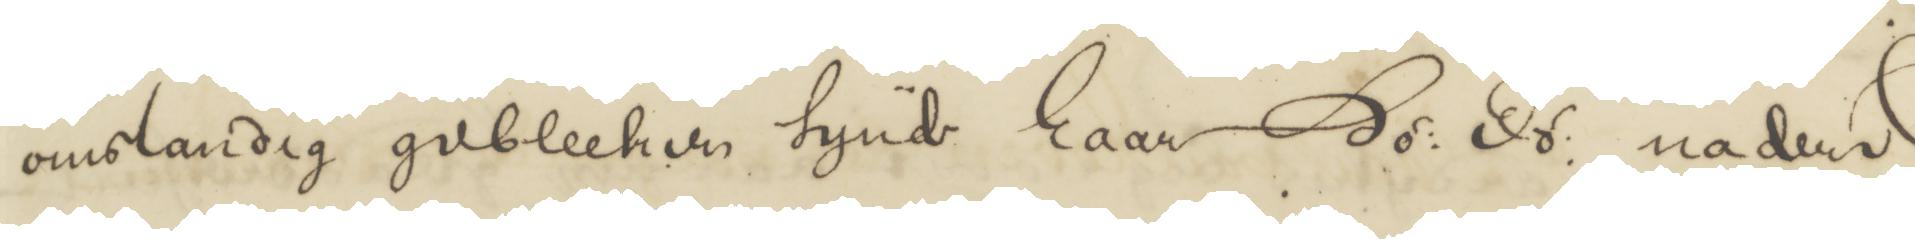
omstandig gebleeken Sijnde haar Ho: Ed: nadere
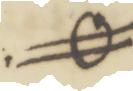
Ø
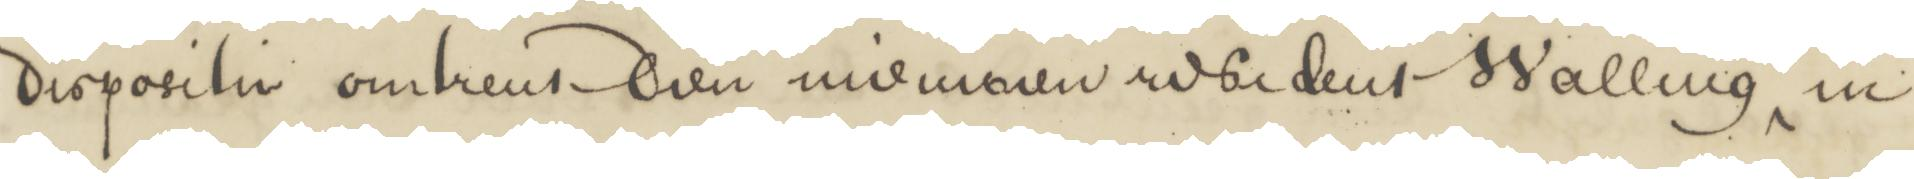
dispositie omtrent den nieuwen resident Walling ^ in
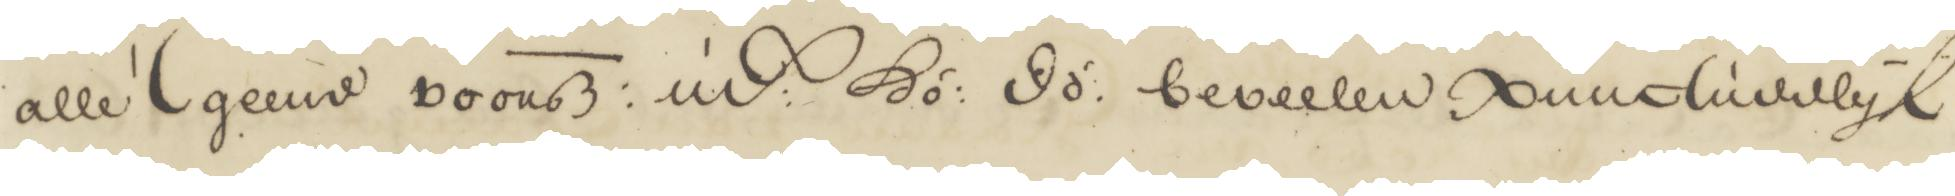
alle ’t geene voorsz: uE: Ho: Ed: beveelen punctueelijk
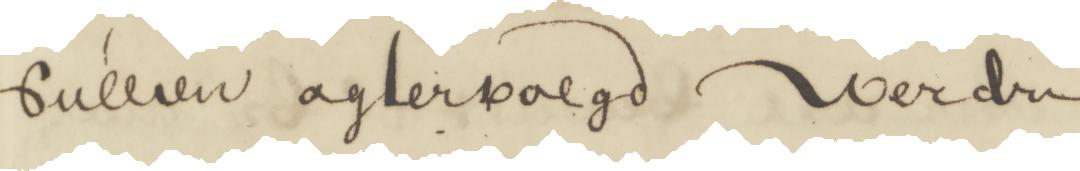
sullen agtervolgd werden
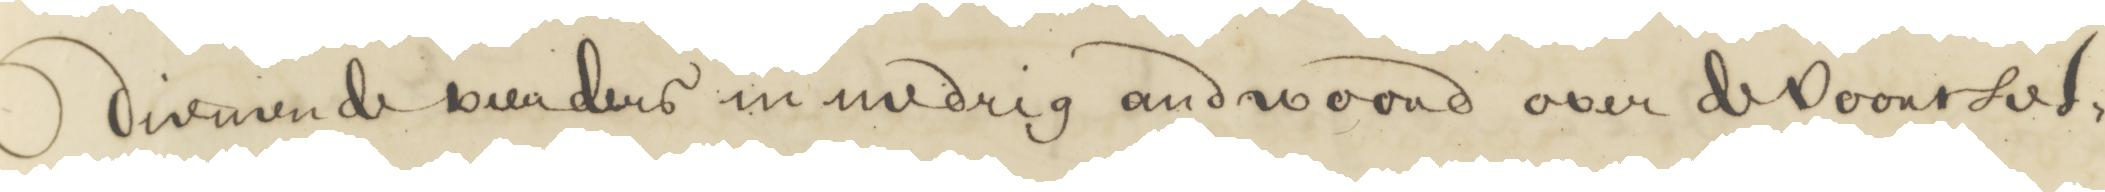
dienen de verders in nedrig andwoord over de voortset„
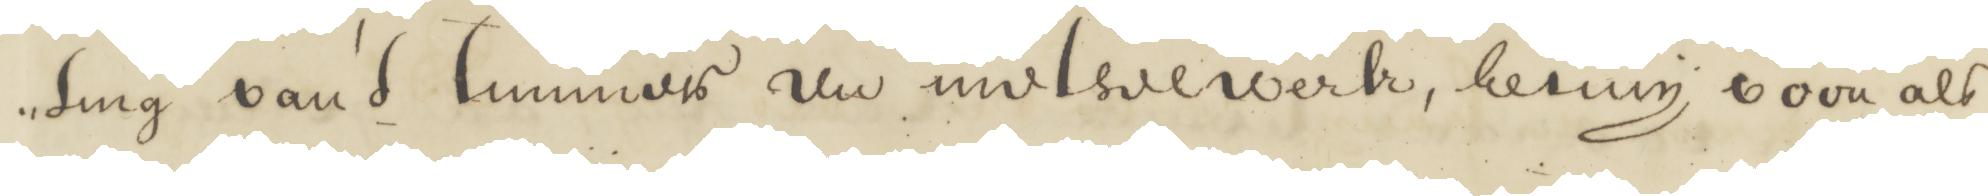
„ting van ’t timmers en metselwerk, het mij voor als
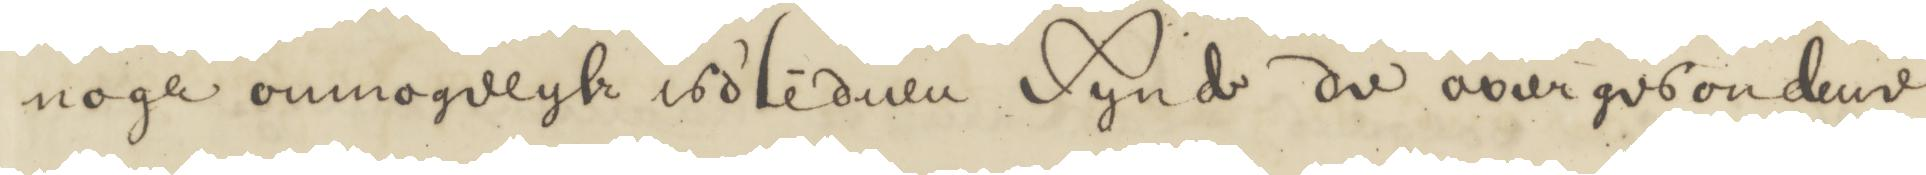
nogh omnogelijk is d' te dien Eijnde de over gesondene
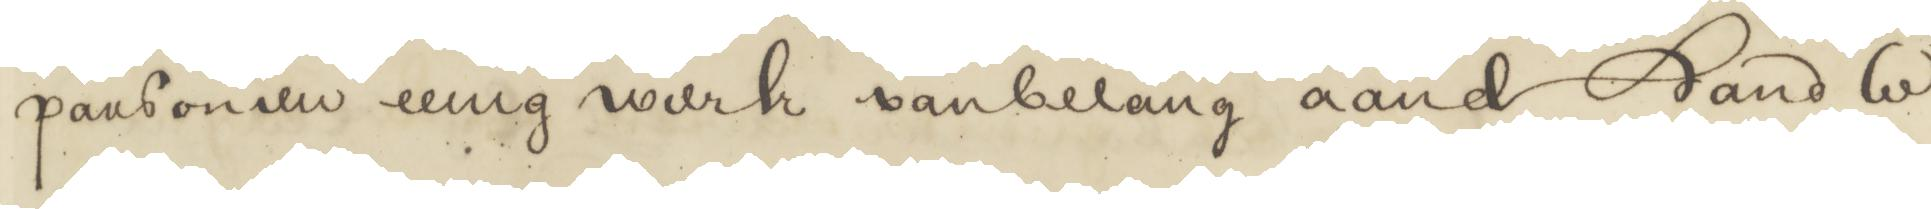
parsonen eenig werk van belang aan de Hand te
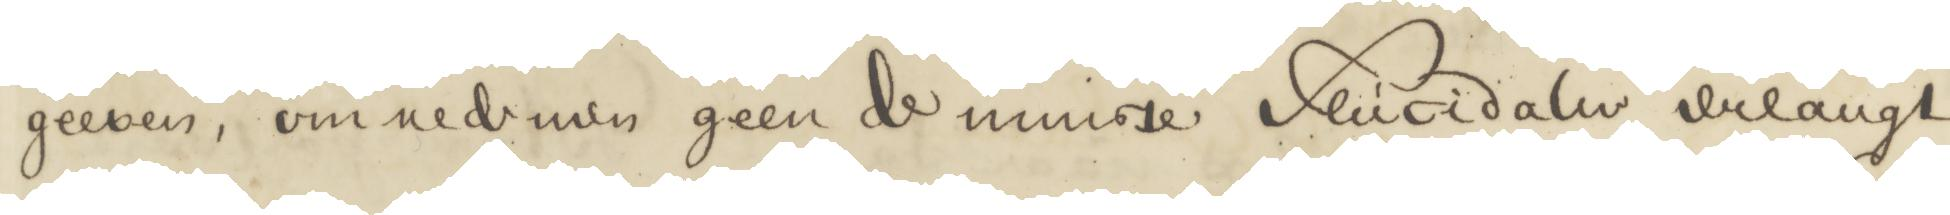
geeven, om redenen geen de minste Elucidatie erlangt
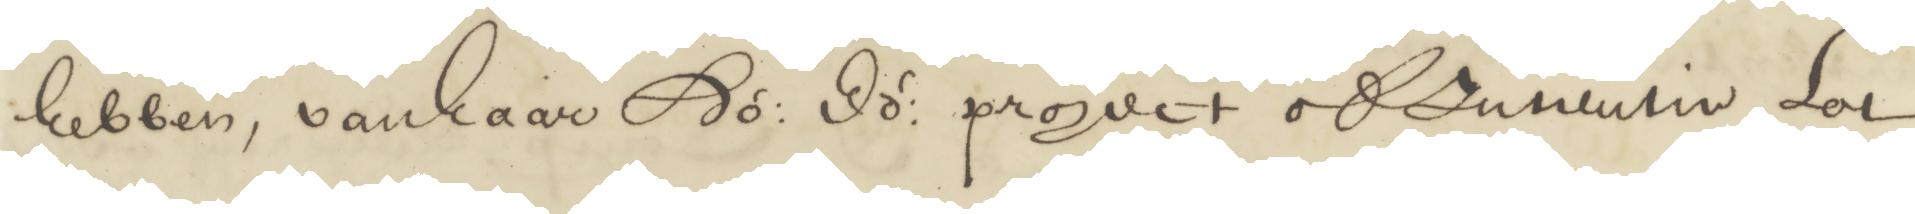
hebben, van haar Ho: Ed: project of Intentie Tot
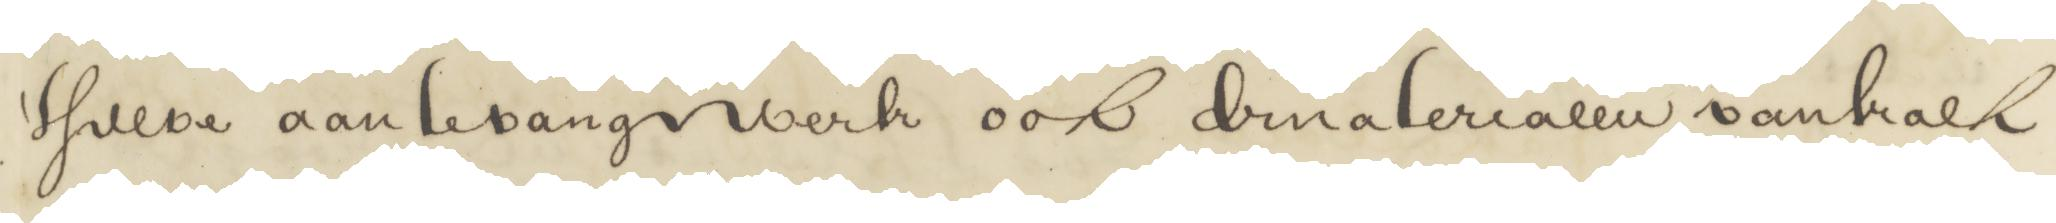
'tselve aan te vange werk ook de materialen van kalk
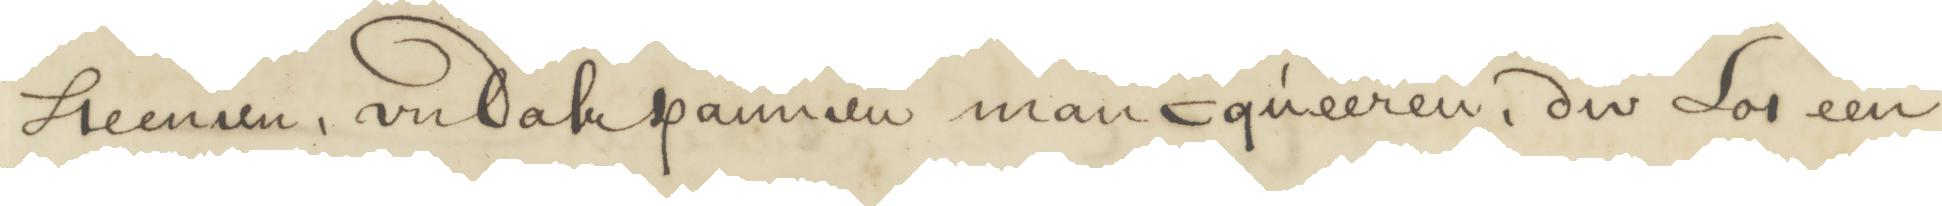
steenen, en dak pannen mancqueeren, die tot een
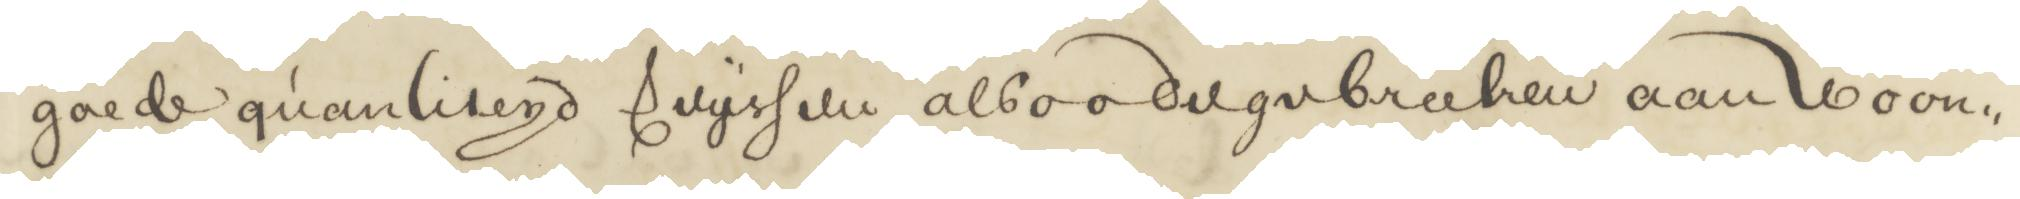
goede quantiteyd vereijssen alsoo de gebreeken aan woon„
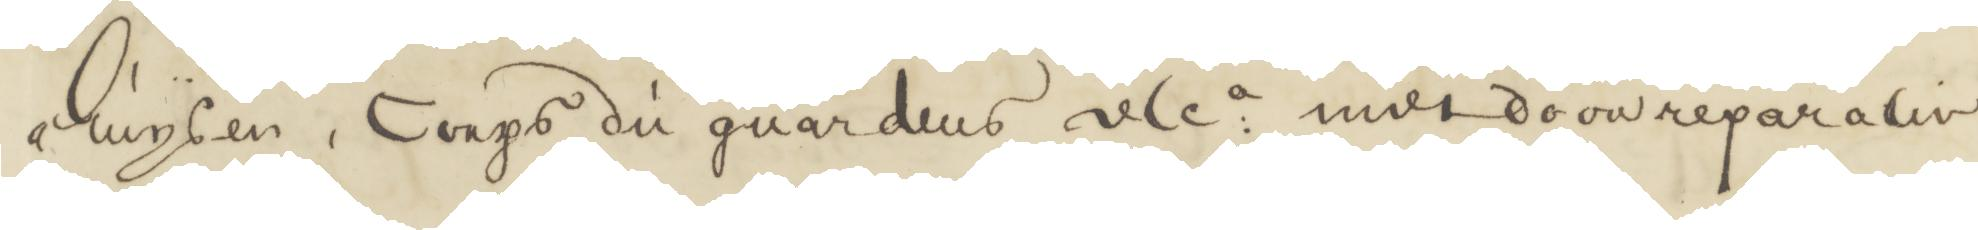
huijsen, Corps du guardens etc:a niet door reparatie
